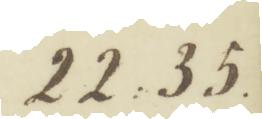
22:35.
